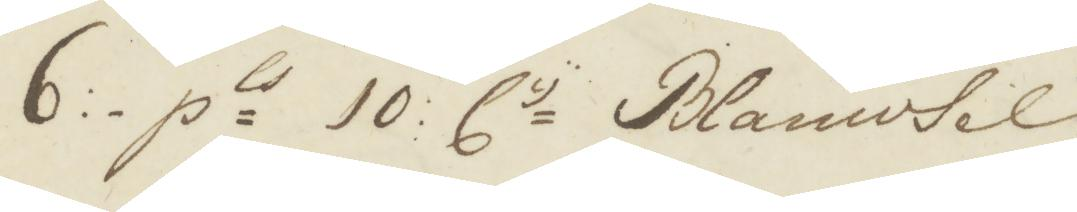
6:– p=ls 10: C=ij Blauwsel
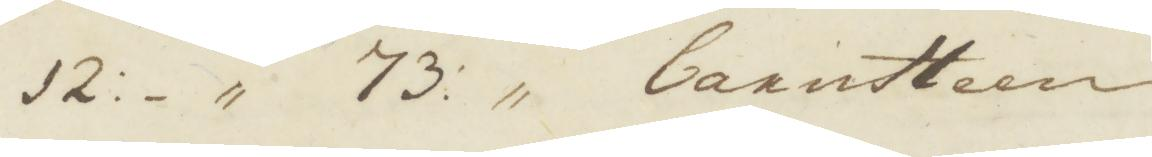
12:- „ 73: „ barnsteen
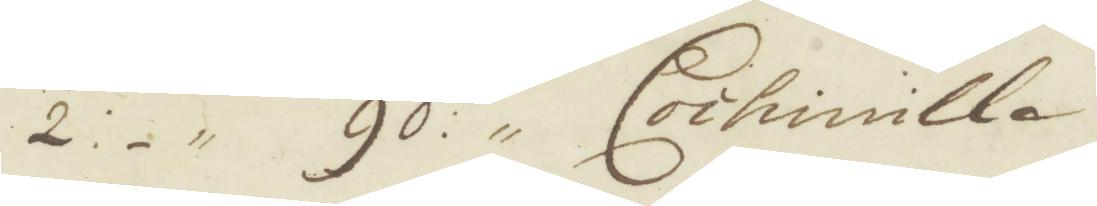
2: - „ 90: „ Cochinilla
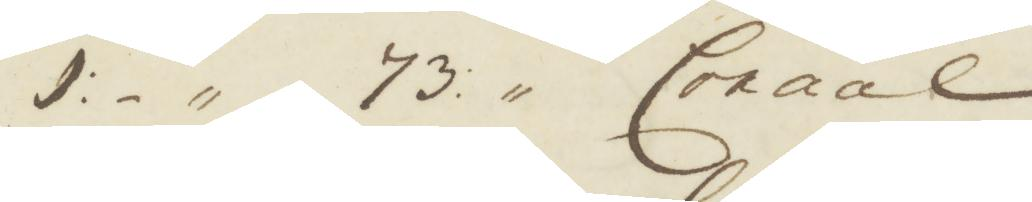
1: - „ 73: „ Coraal
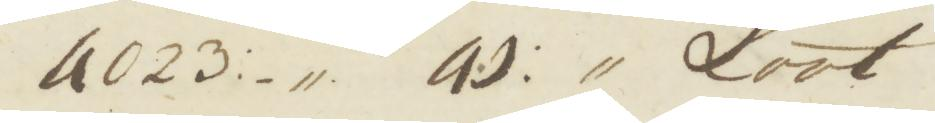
4023:-„ 41: „ Loot
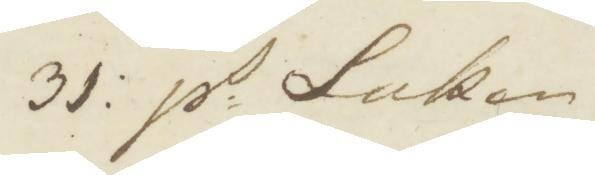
31: p:s Laken
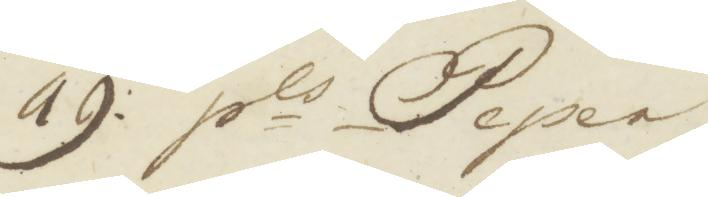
49: p=ls Peper
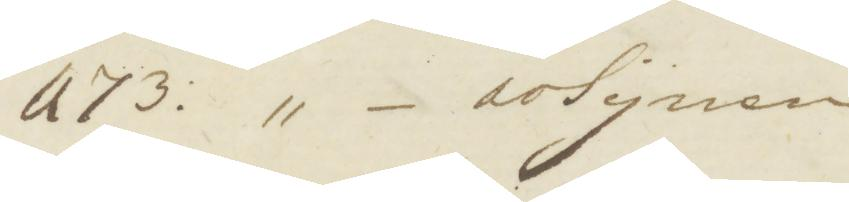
473: „ - rosijnen
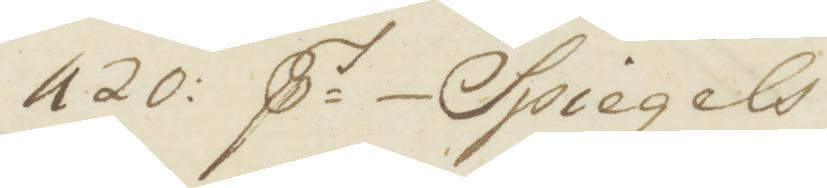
420: p=s - Spiegels
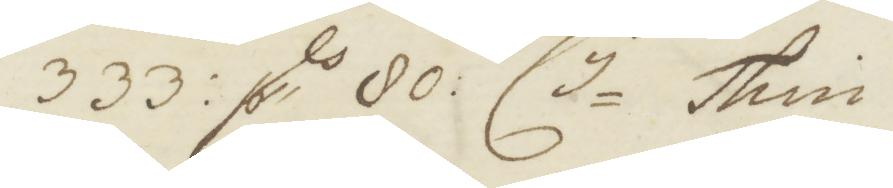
333: p„ls 80: C=ij Thin
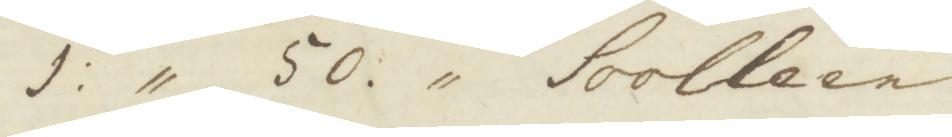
1: „ 50. „ soolleer
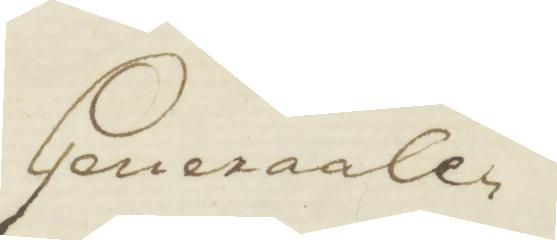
Generaalen
